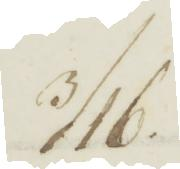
3/16.
